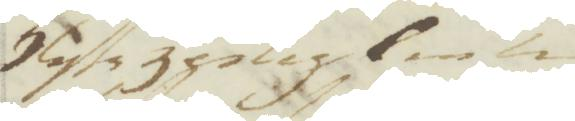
Vijf zestig Cents
